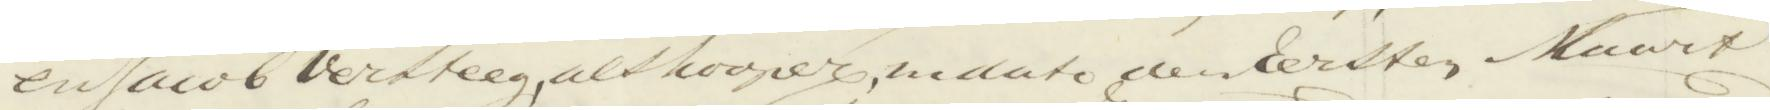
en Jacob Versteeg, als kooper, in dato den Eersten Maart
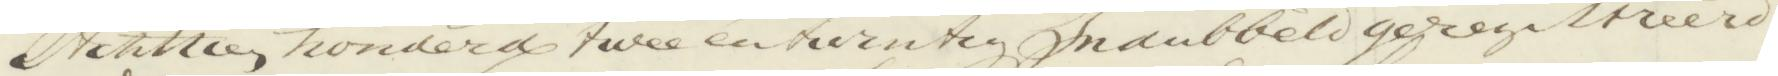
Achttien honderd twee en twintig In dubbeld geregistreerd
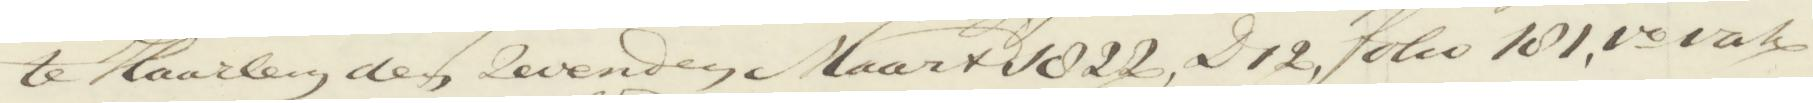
te Haarlem den Zevenden Maart 1822, D12, folio 181, v-o vak
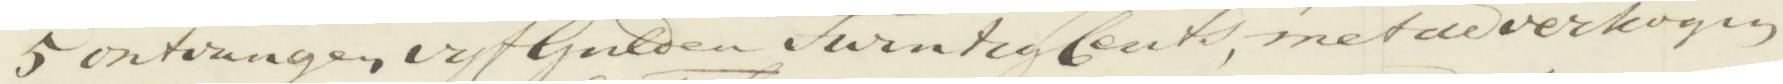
5 ontvangen vyf Gulden Twintig Cents, met de verkopin
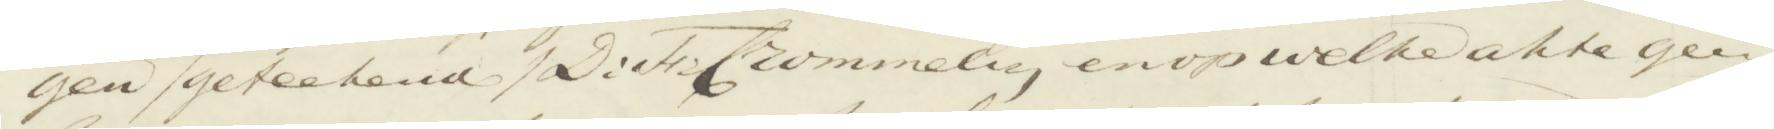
gen /geteekend/ D: F: Crommelin en op welke akte geen
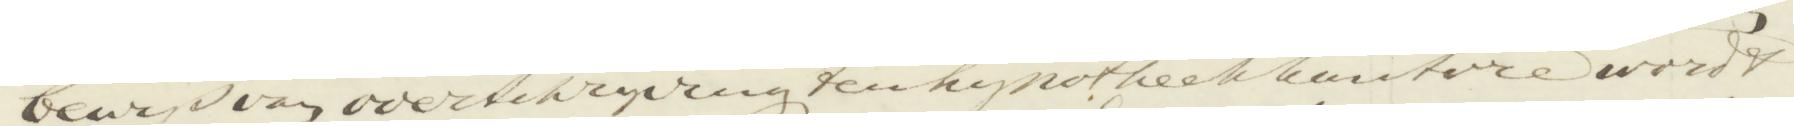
bewys van overschrijving ten hypotheekkantore wordt
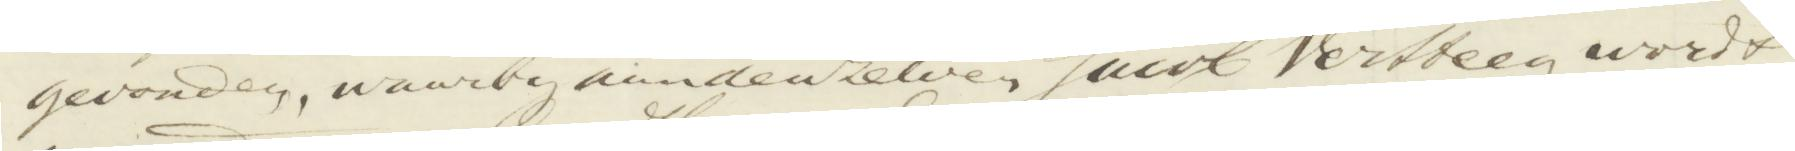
gevonden, waarby aan denzelven Jacob Versteeg wordt
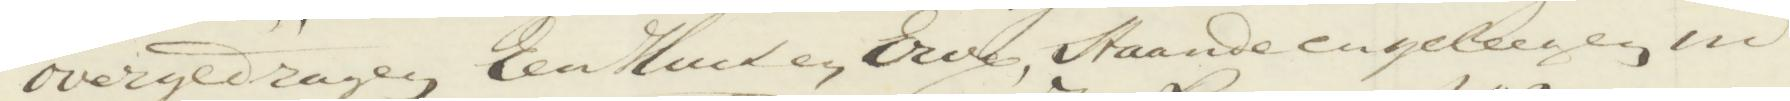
overgedragen Een Huis en Erve, staande en geleegen in
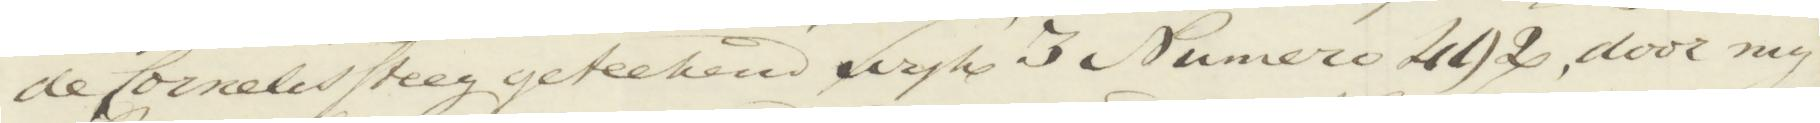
de Cornelissteeg geteekend wyk 3 Numero 492, door my
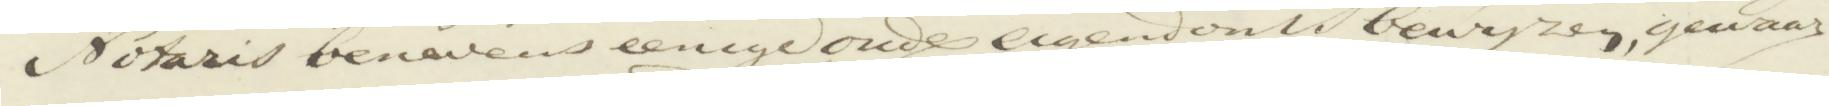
Notaris benevens eenige oude eigendoms bewyzen, gewaar
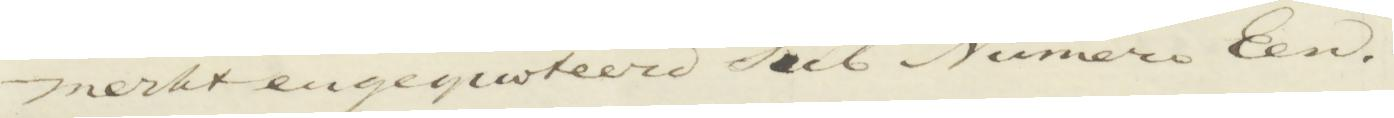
merkt en gequoteerd sub Numero Een.
